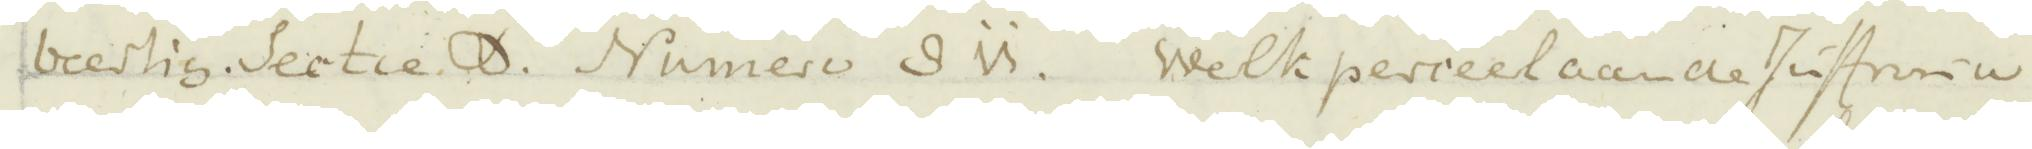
veertig. sectie D. Numero 9 ii. Welk perceel aan de Juffrouw
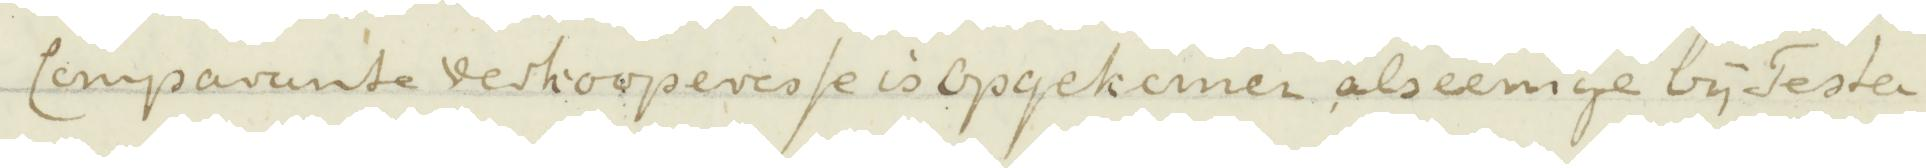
Comparante verkooperesse is opgekomen, als eenige bij Testa
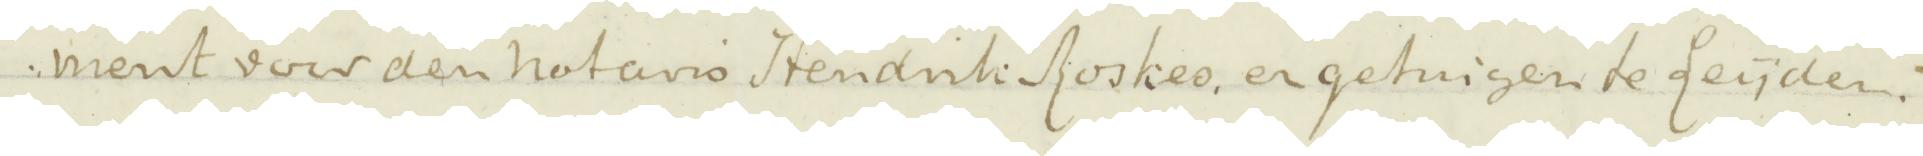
ment voor den notaris Hendrik Roskes, en getuigen te Leijden.
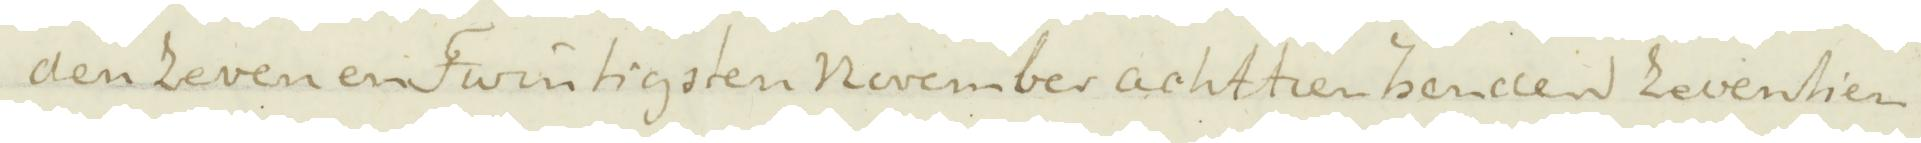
den zeven en Twintigsten November achttien honderd zeventien
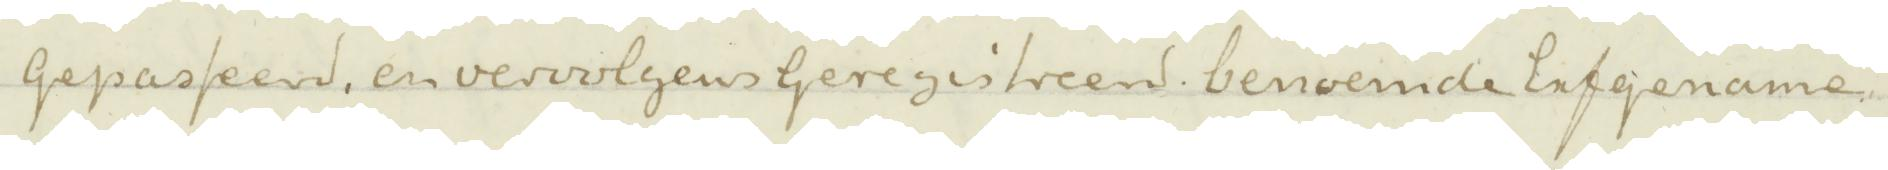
Gepasseerd, en vervolgens Geregistreerd benoemde Erfgename
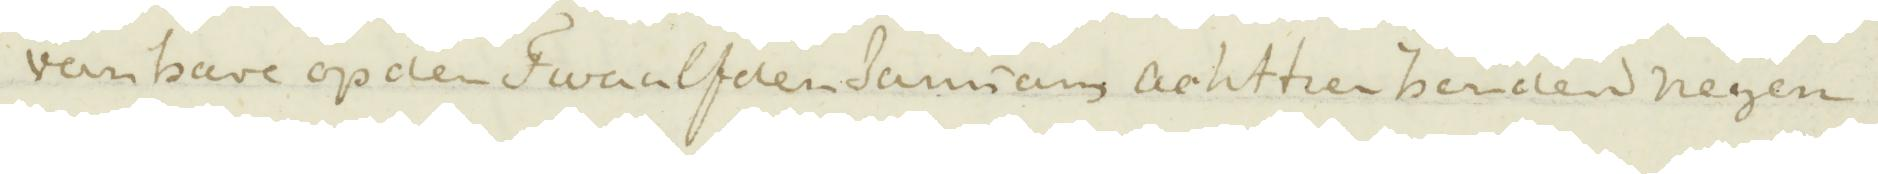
van hare op den Twaalfden January achttien honderd negen
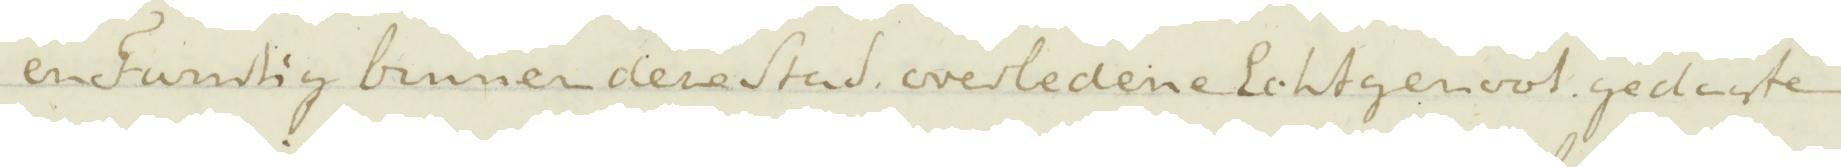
en Twintig binnen deze stad, overledene Echtgenoot, gedagte
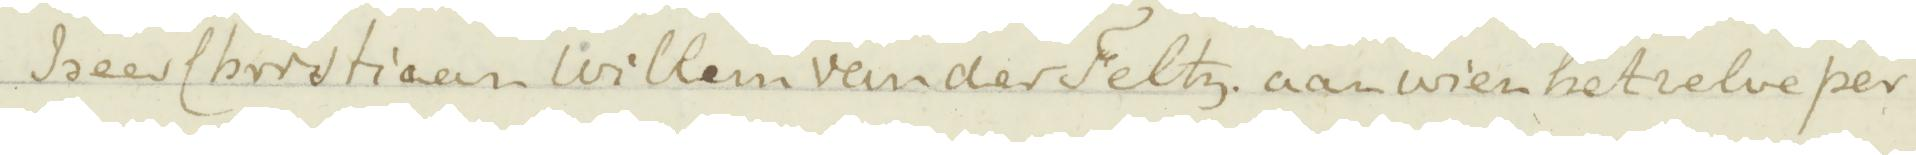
heer Christiaan Willem van der Feltz. aan wien het zelve per
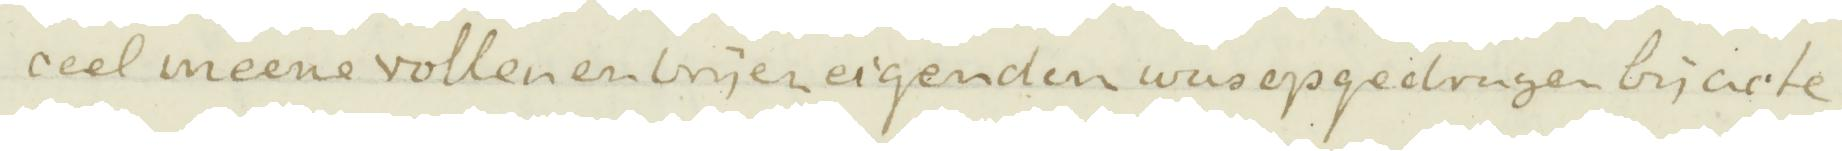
ceel meene vollen en vrijen eigendom was opgedragen bij acte
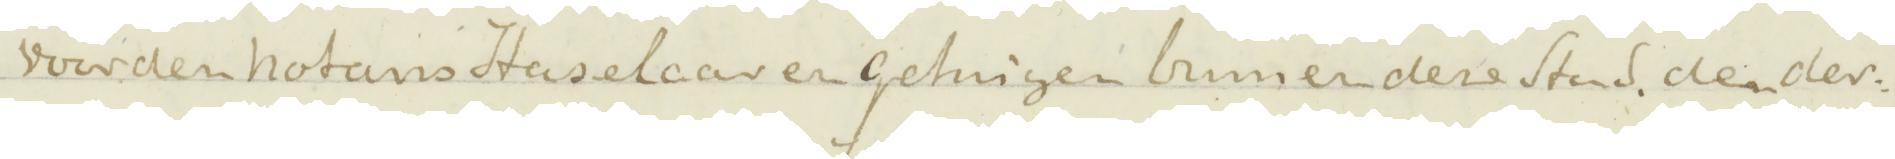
voor den notaris Haselaar en getuigen binnen deze stad, den der-
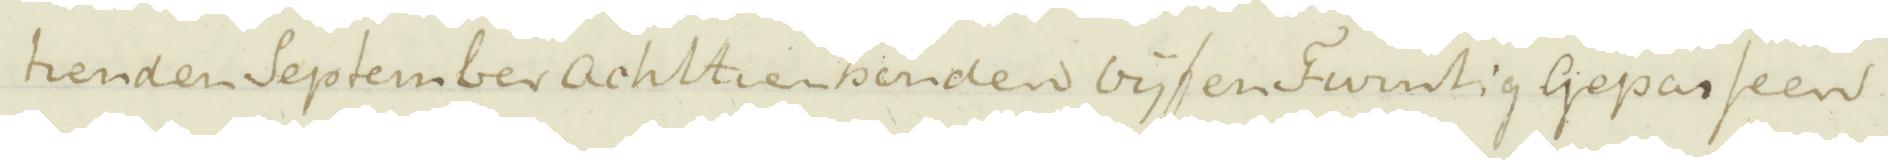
tienden september achttien honderd vijf en Twintig Gepasseerd
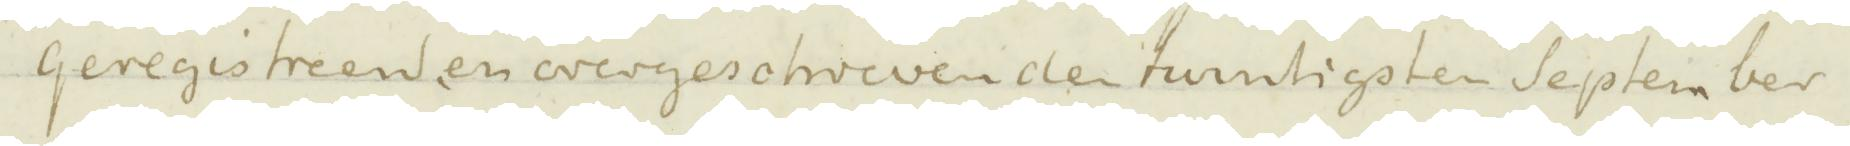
Geregistreerd en overgeschreven den twintigsten september
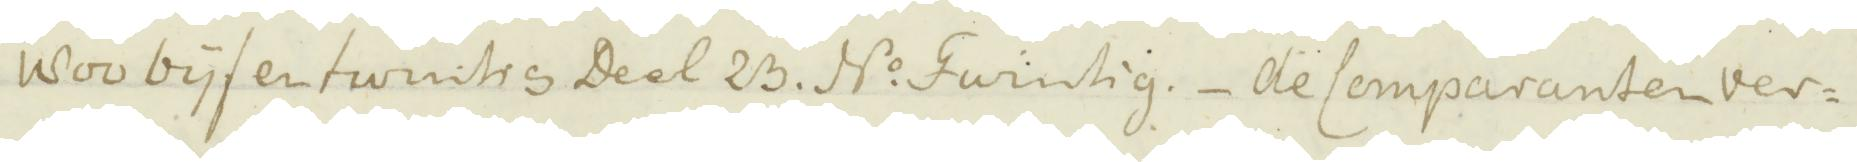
1800 vijf en twintig Deel 23. N.o Twintig. - de Comparanten ver=
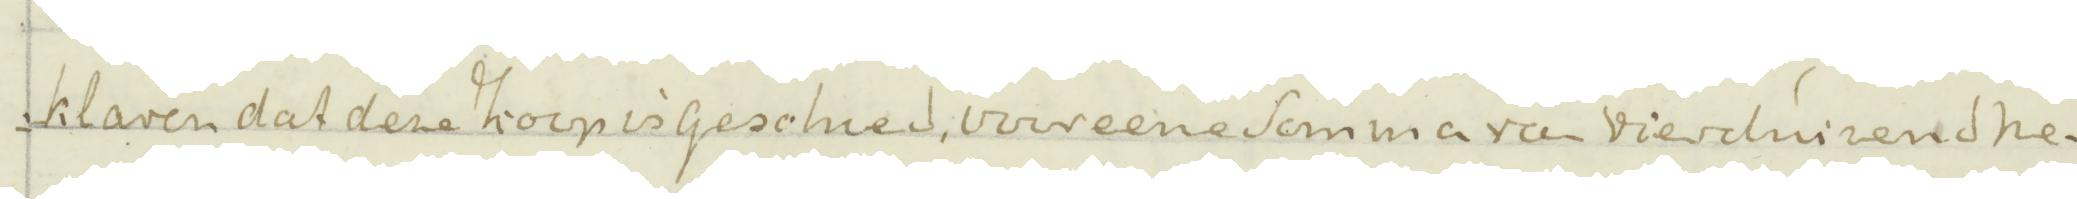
=klaren dat deze koop is geschied voor eene somma van vierduizend ne
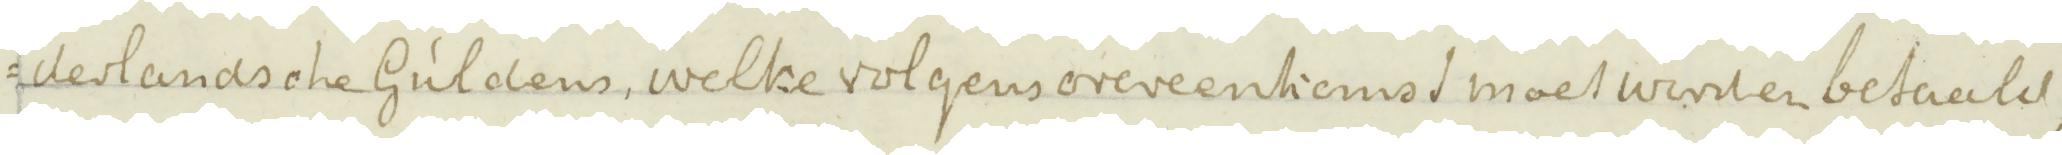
derlandsche Guldens, welke volgens overeenkomst moet worden betaald
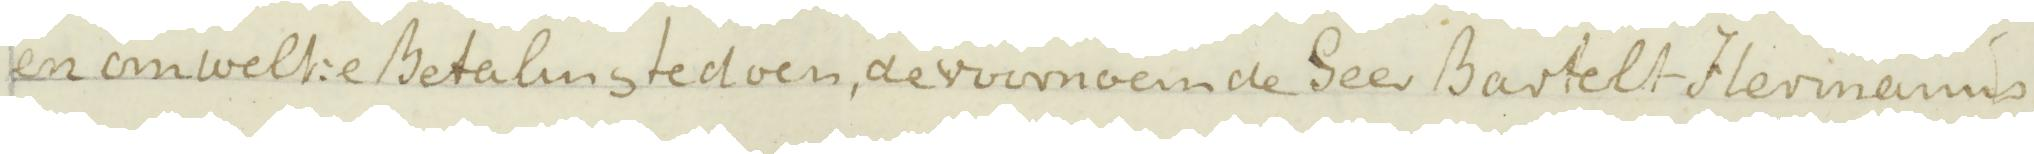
en om welke Betaling te doen, de voornoemde Heer Bartelt Hermanus
